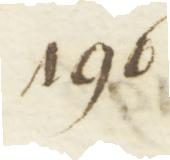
196
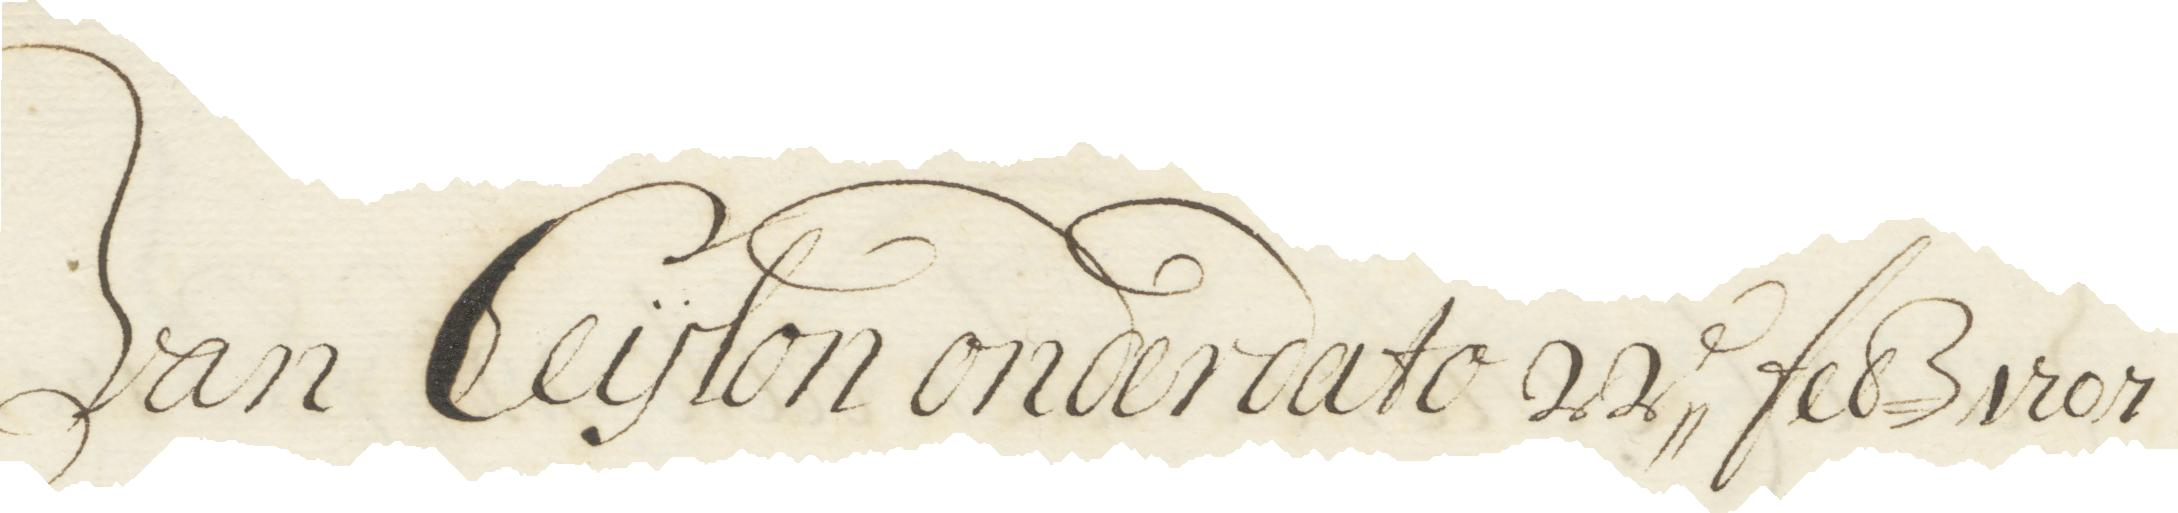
Van Ceijlon onder dato 22„e feb= 1707
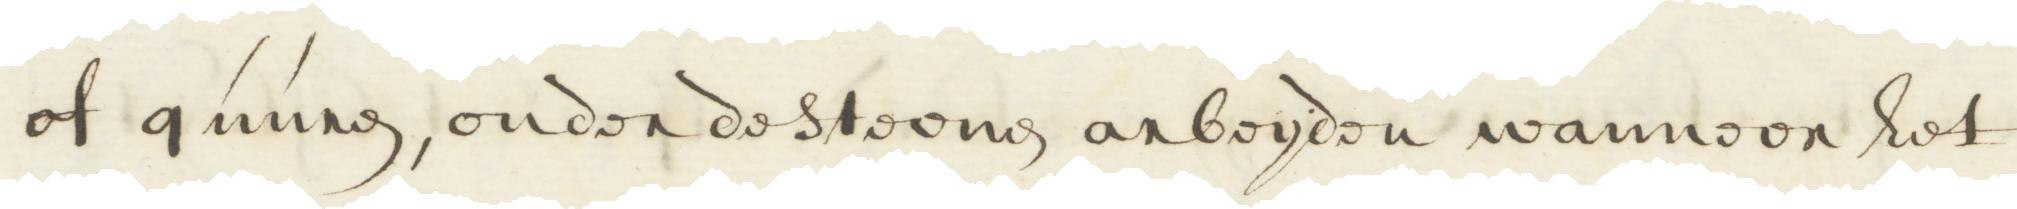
of quuren, onder de steenen arbeijden wanneer het
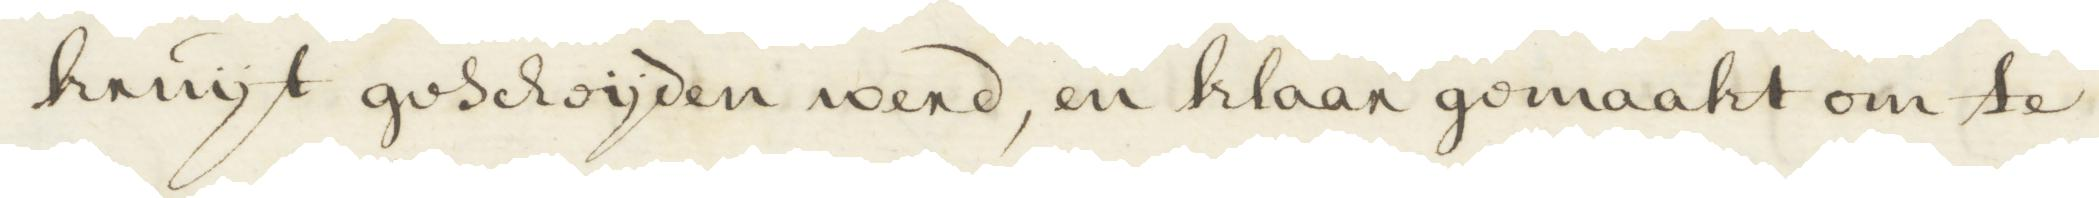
kruijt gescheijden werd, en klaar gemaakt om te
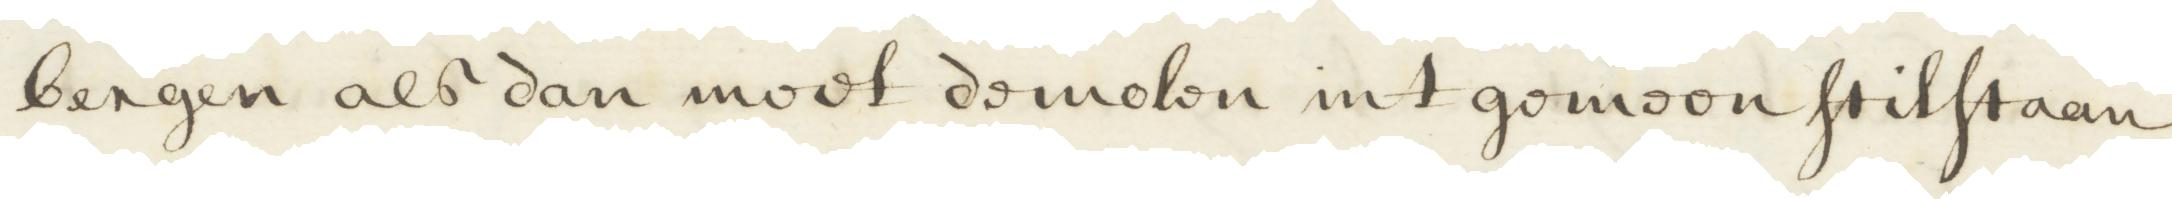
bergen als dan moet de molen int gemeen stilstaan
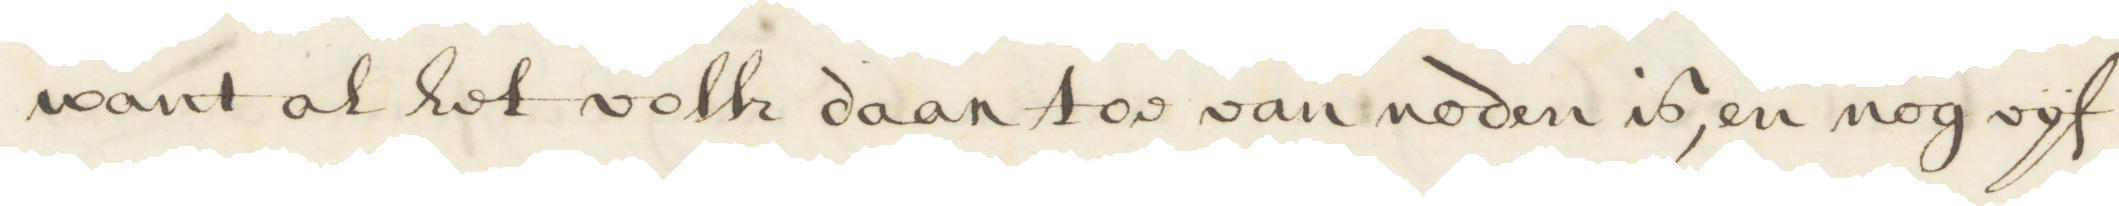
want al het volk daar toe van noden is, en nog vijf
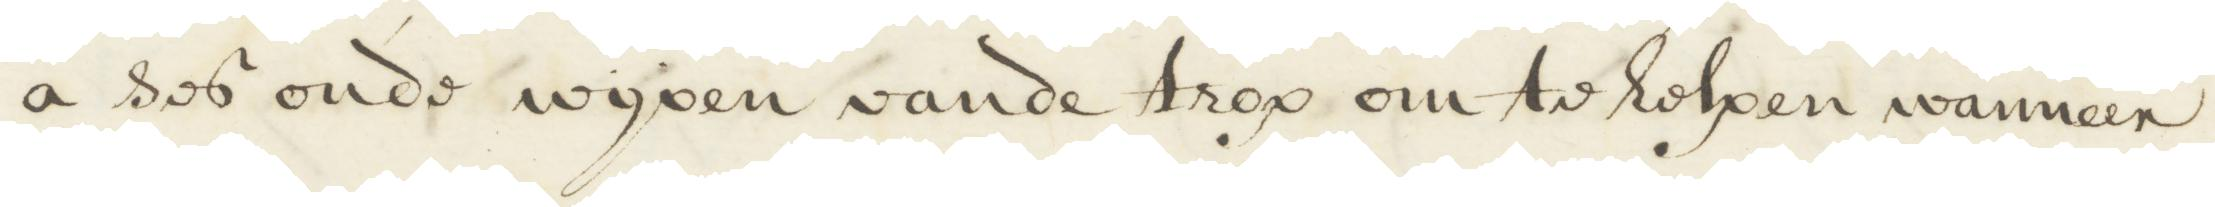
a ses oude wijven vande trop om te helpen wanneer
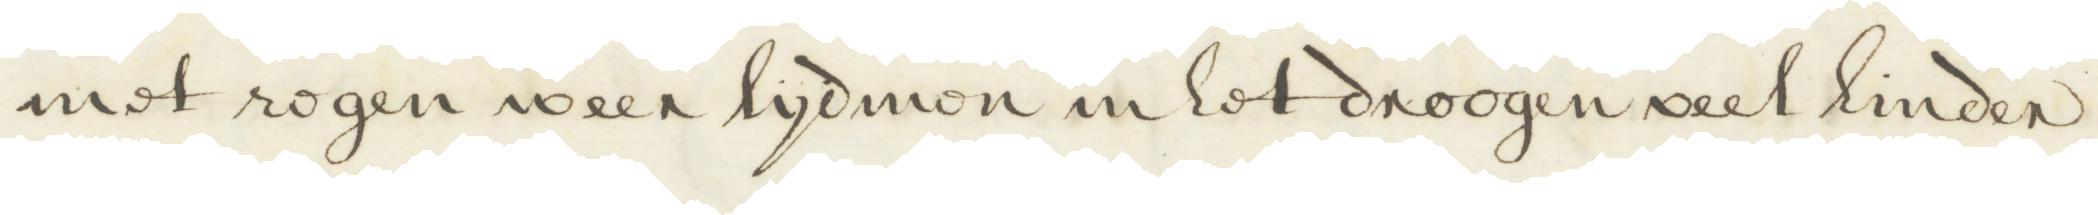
met regen weer lijd men in het droogen veel hinder
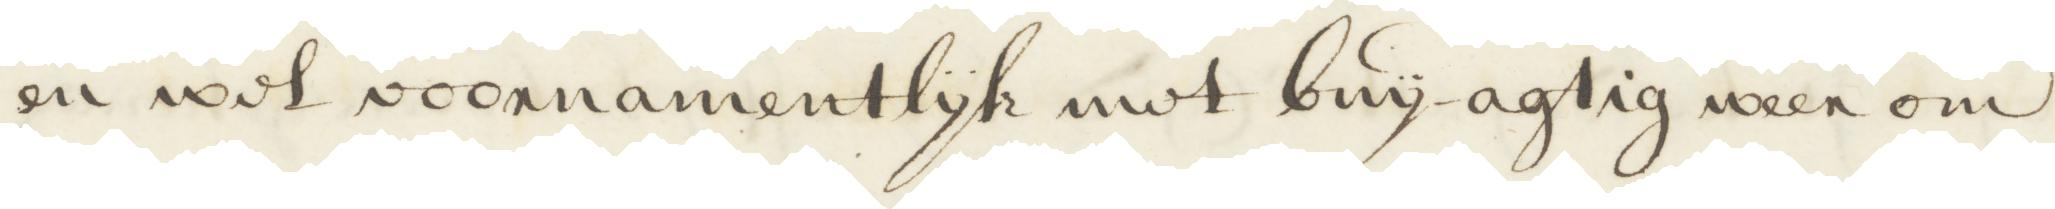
en wel voornamentlijk met buij-agtig weer om
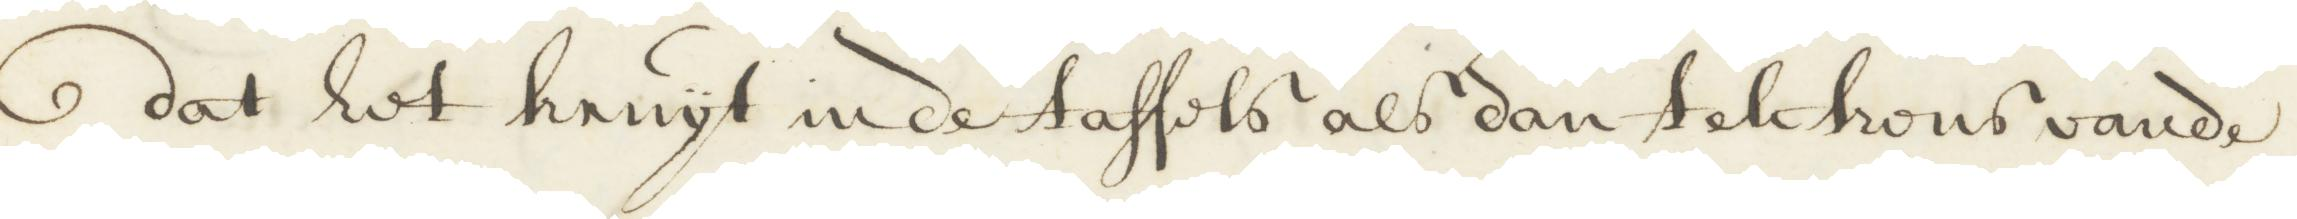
dat het kruijt in de taffels als dan telckens vande
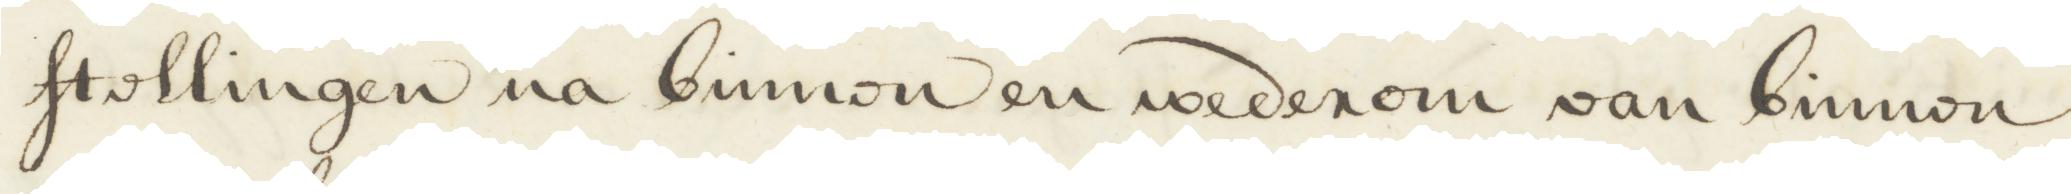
stellingen na binnen en wederom van binnen
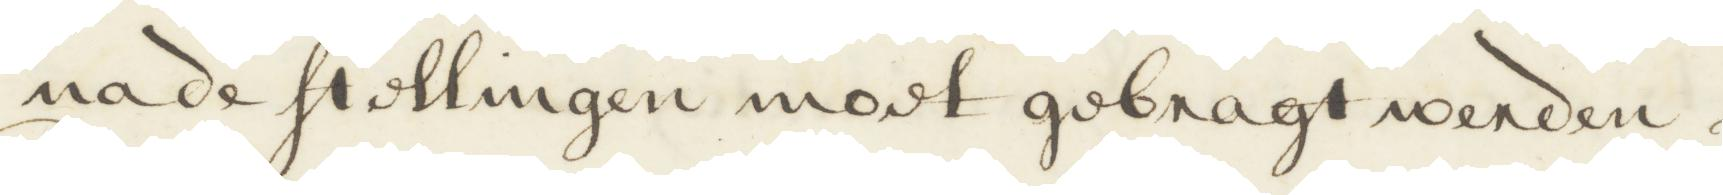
na de stellingen moet gebragt werden
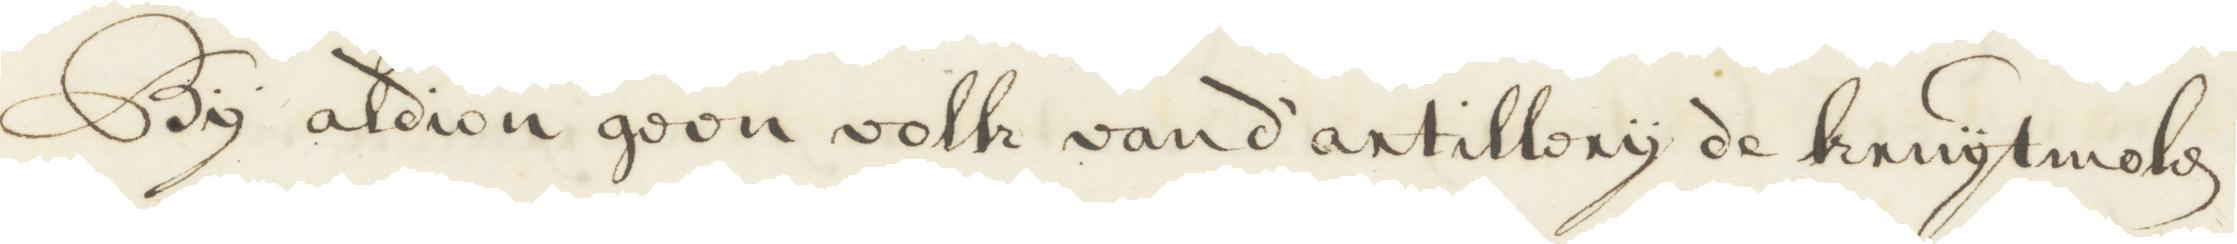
Bij aldien geen volk van d’artillerij de kruijtmolen
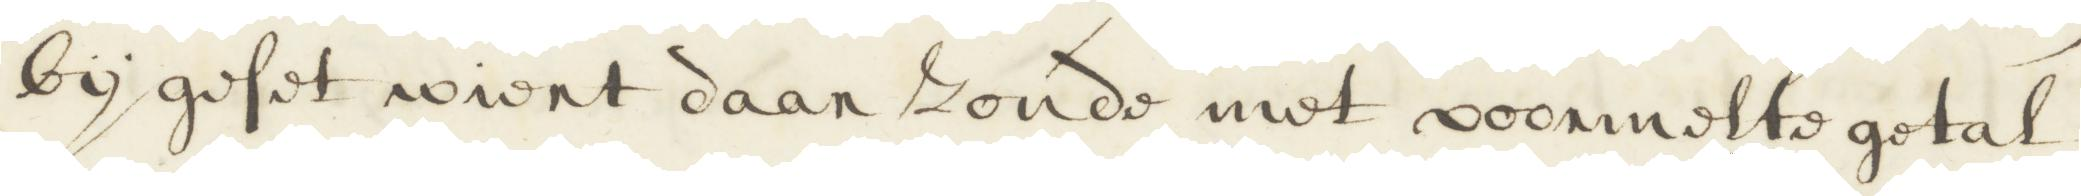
bij geset wiert daar zoude met voormelte getal
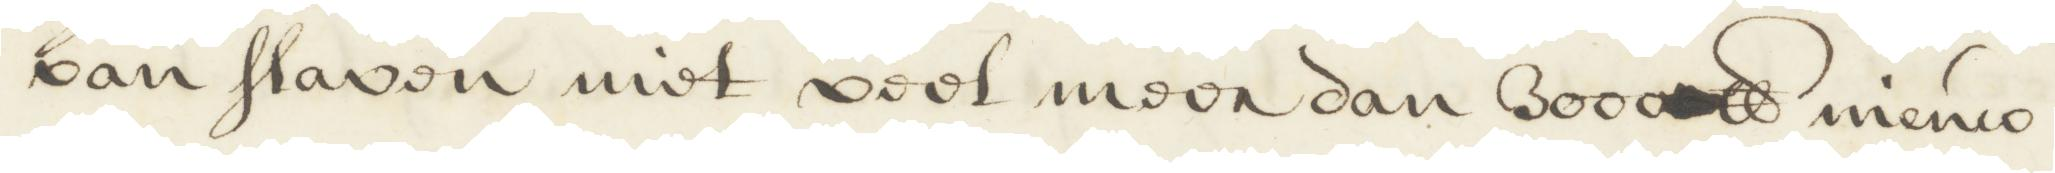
van slaven niet veel meer dan 3000 lb nieuw
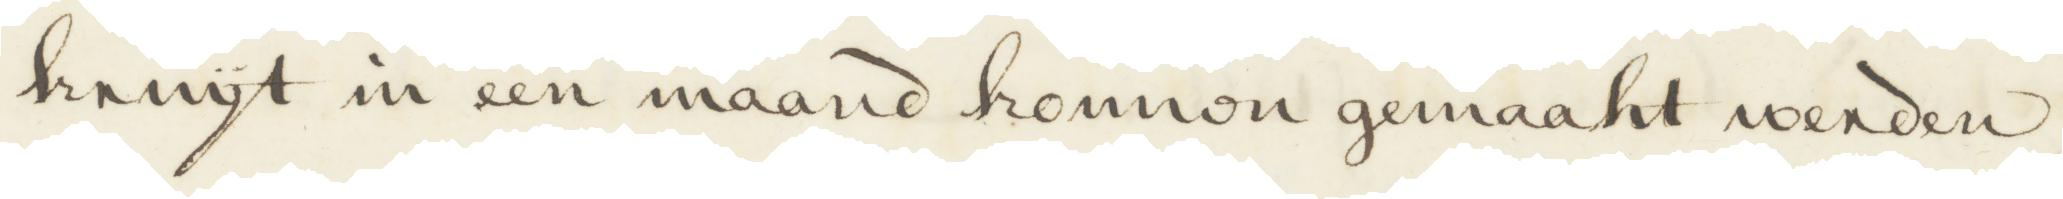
kruijt in een maand konnen gemaakt werden
